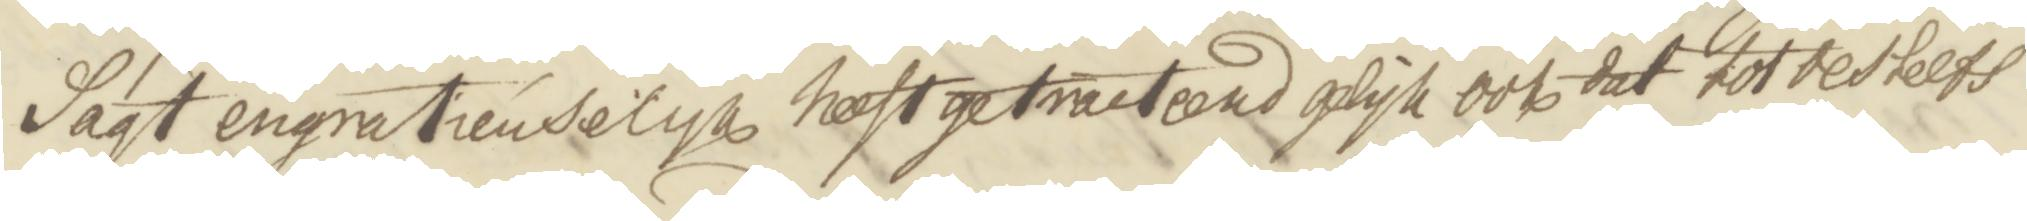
sagt en gratieuselyk heeft getracteerd gelijk ook dat tot desselfs
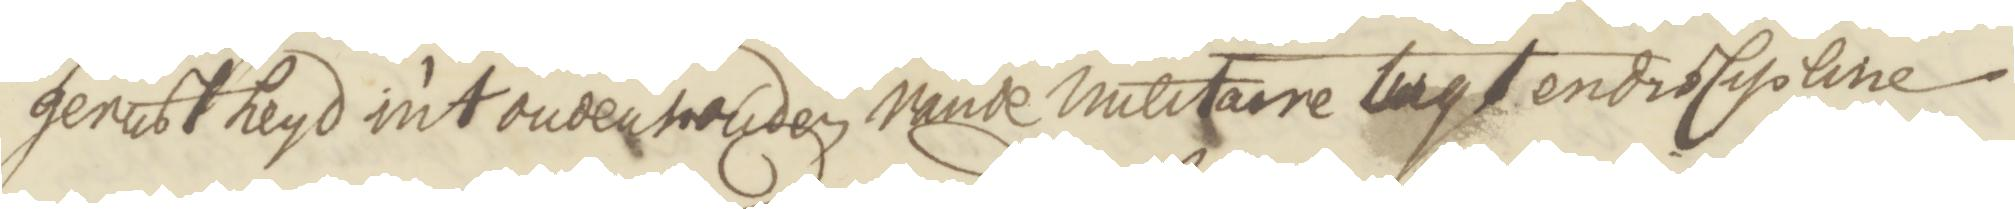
gerustheyd in’t onderhouden van de militaire tugt en discipline
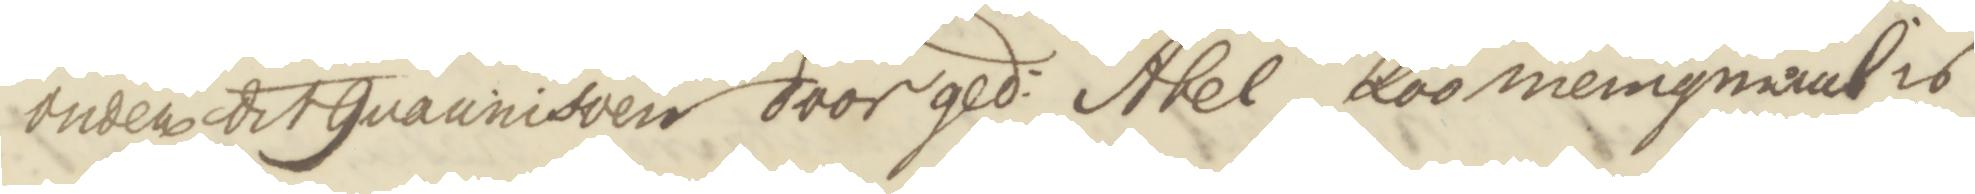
onder dit guarnisoen door ged: Abel zoo menigmaal is
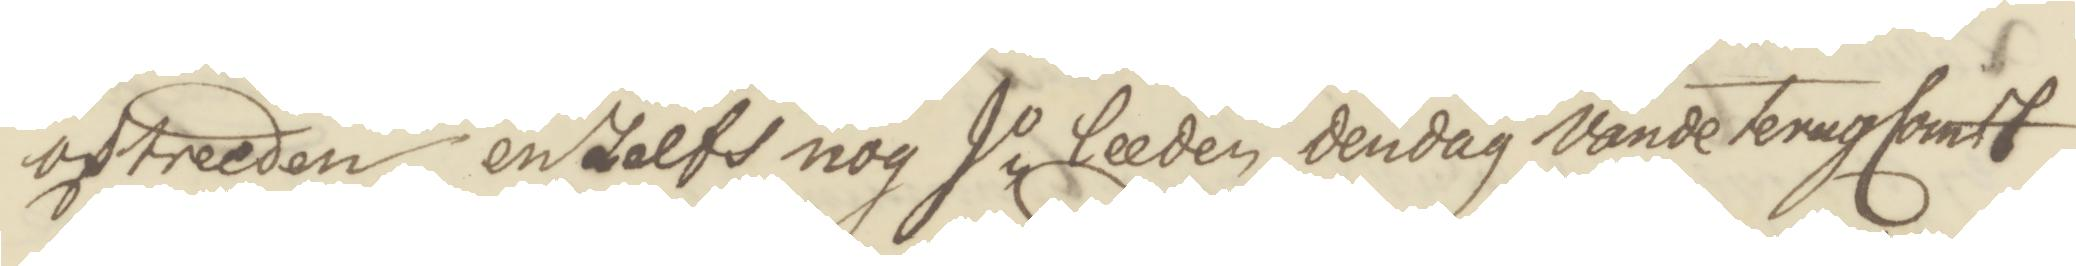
overtreeden en zelfs nog J„o leeden den dag van de terugcomst
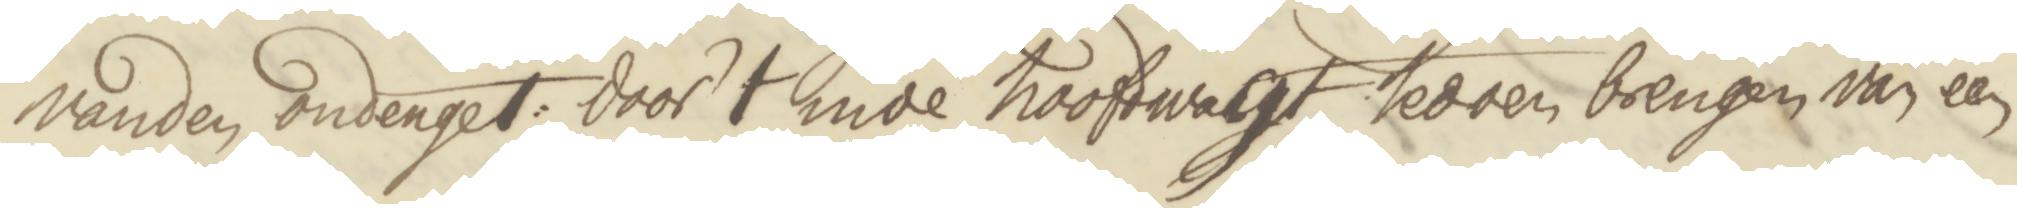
van den onderget: door’t inde hoofdwagt tedoen brengen van een
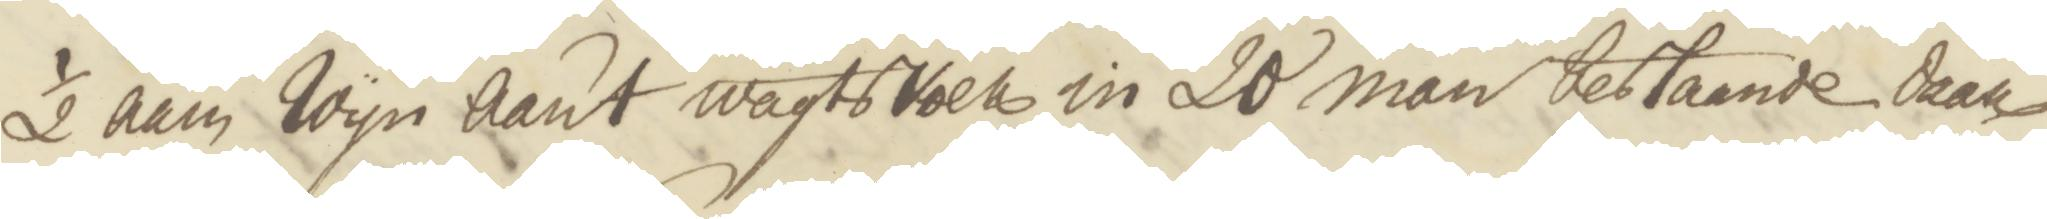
½ aam wijn aan't wagtsvolk in 20 man bestaande daar
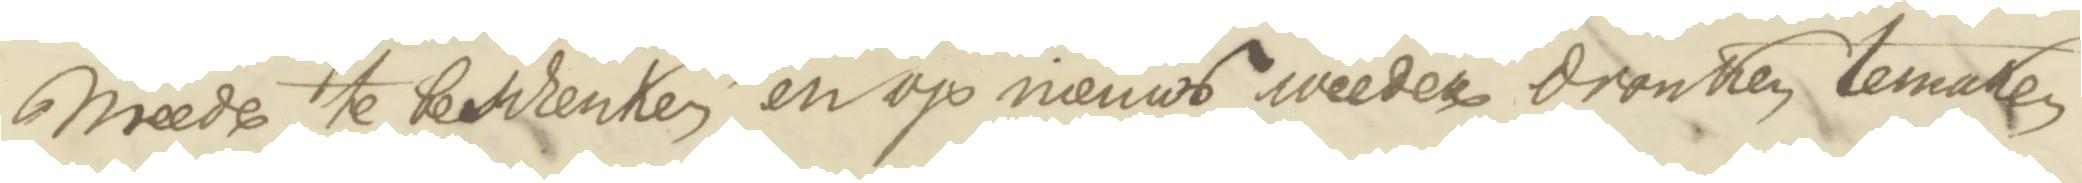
meede te beschenken en op nieuws weeder dronken te maken
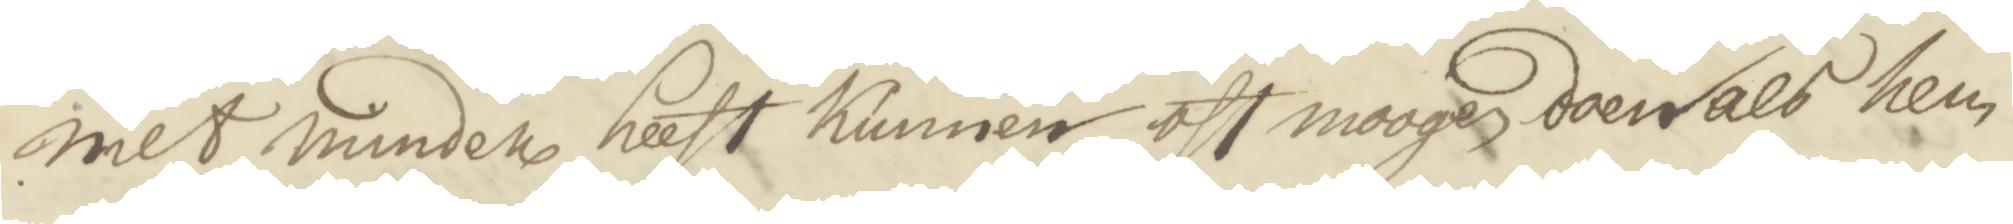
niet minder heeft kunnen oft moogen doen als hem
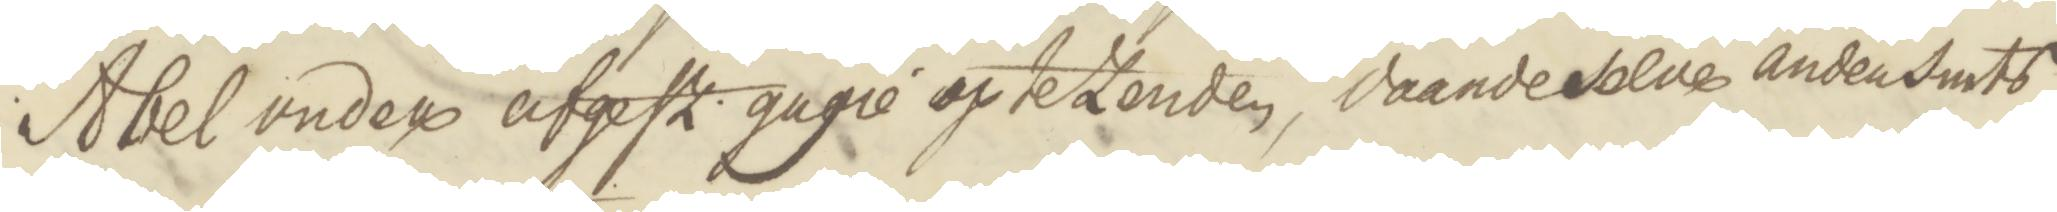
Abel onder afgesz. gagie op te zenden, daar deselve andersints
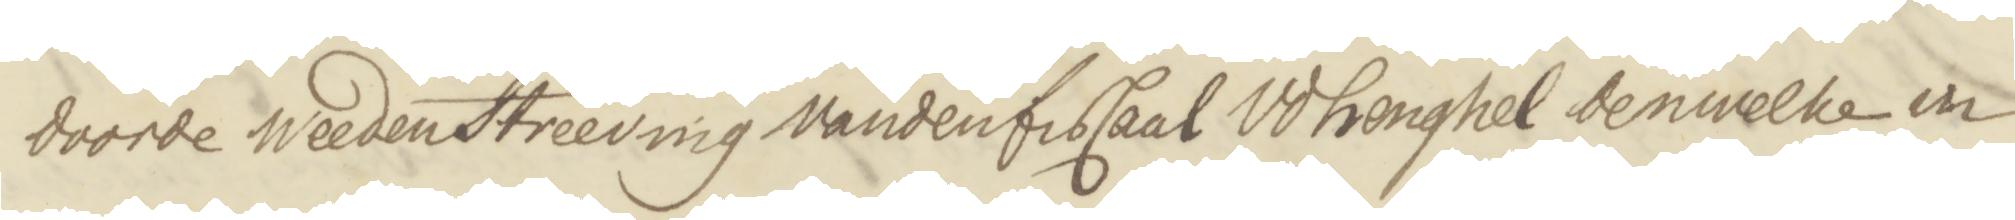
doorde weederstreeving van den fiscaal vdhenghel denwelke in
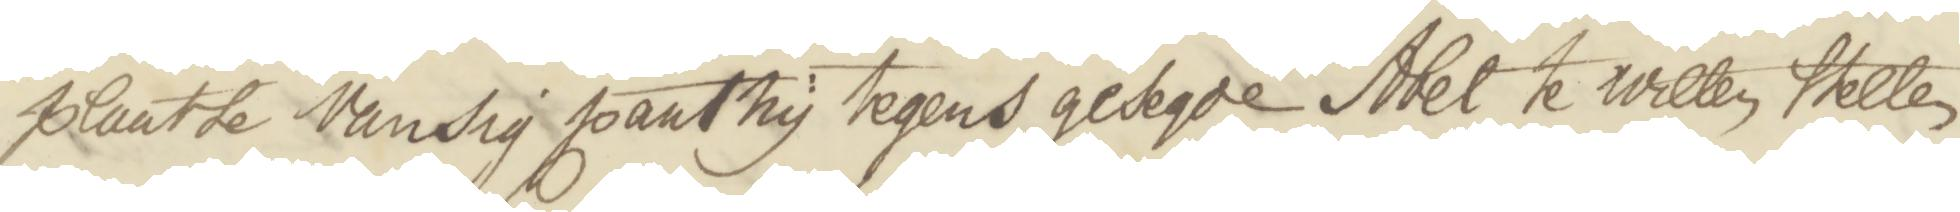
plaatse van sig parthij tegens gesegde Abel te willen stellen
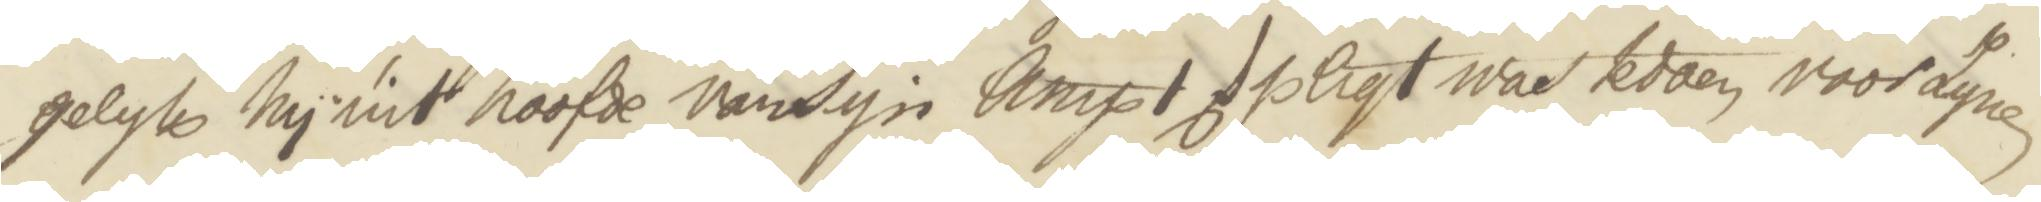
gelyk hij uit hoofde van sijn ampt verpligt was te doen voor zynen
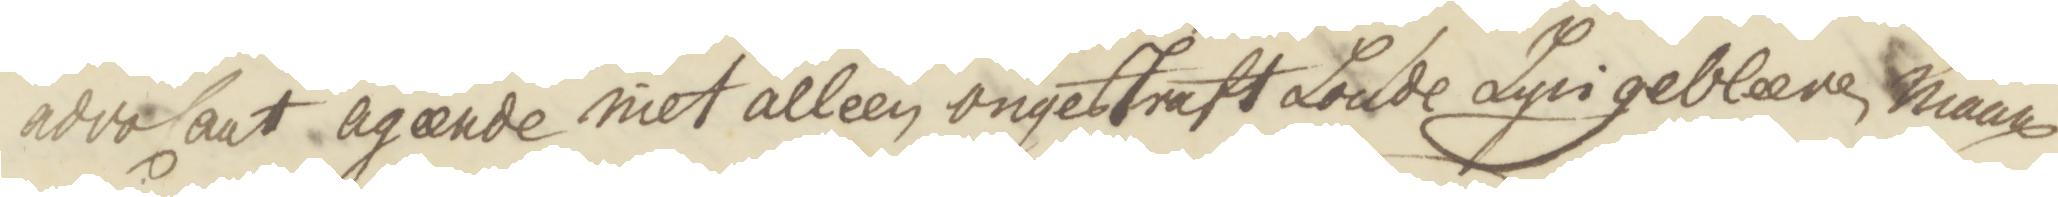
advocaat ageerde niet alleen ongestraft zoude zyn gebleeven maar
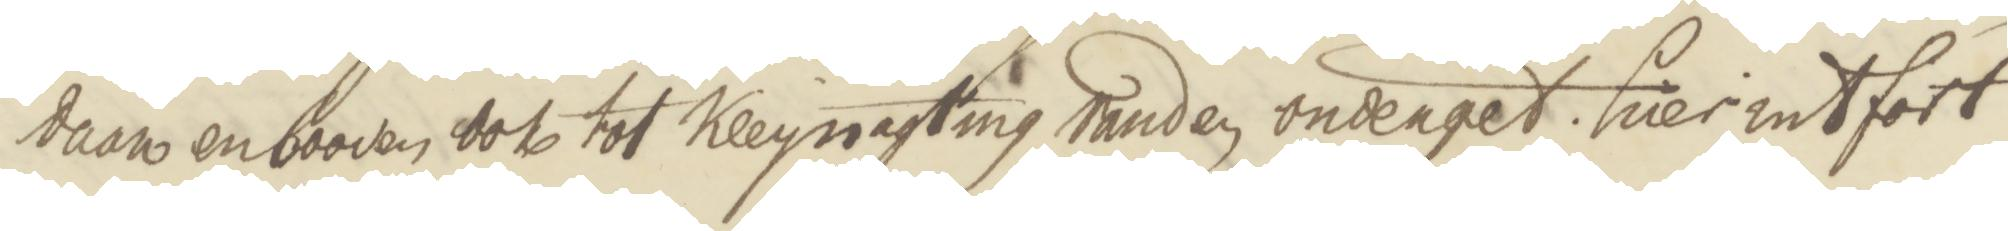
daar en booven ook tot kleijnagting van den onderget. hier int fort
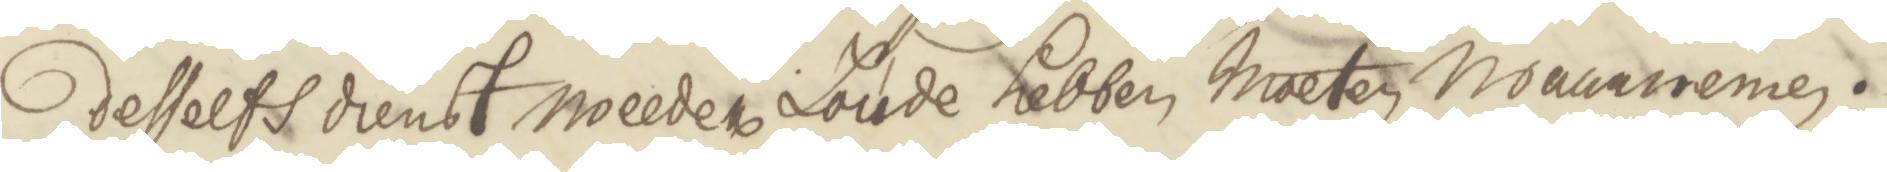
desselfs dienst weeder zoude hebben moeten waarnemen.
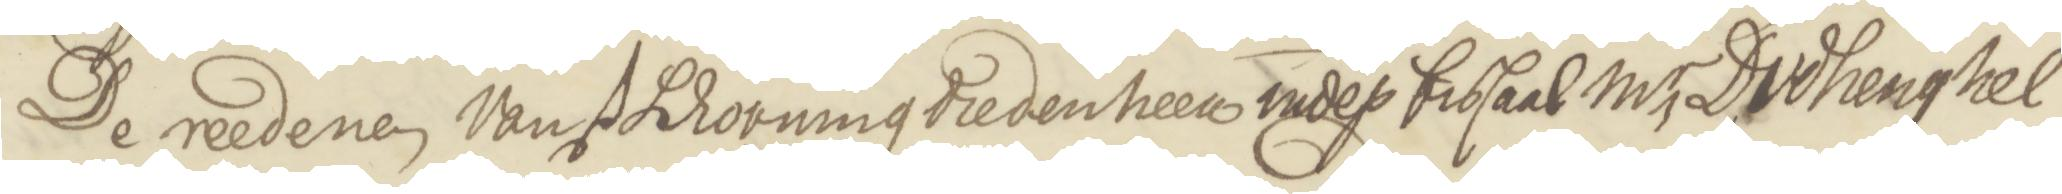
De reedenen van verschooning die den heer indep fiscaal m„r Dvdhenghel
